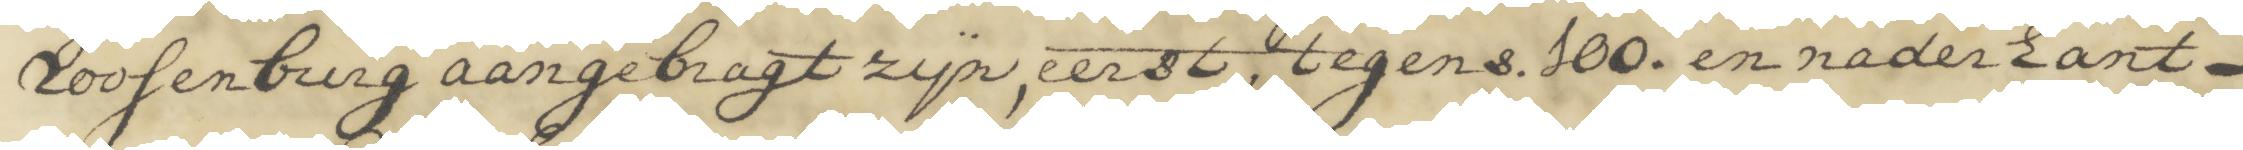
roosenburg aangebragt zijn, eerst; tegens. 100. en nader hant
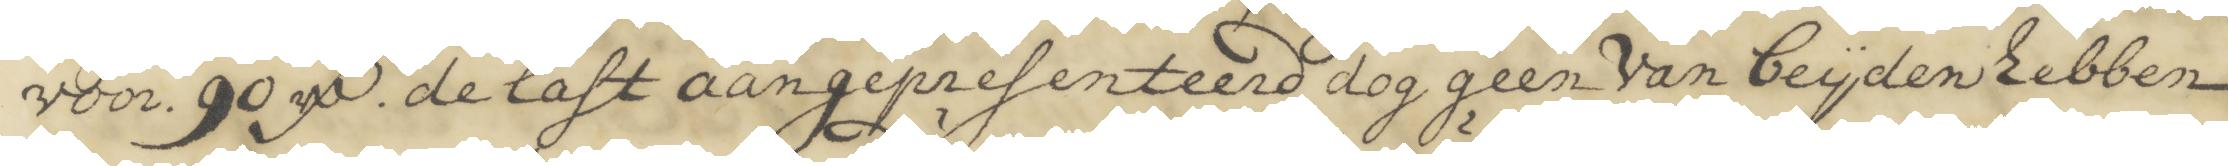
voor. 90 rp. de last aangepresenteerd, dog geen van beijden hebben
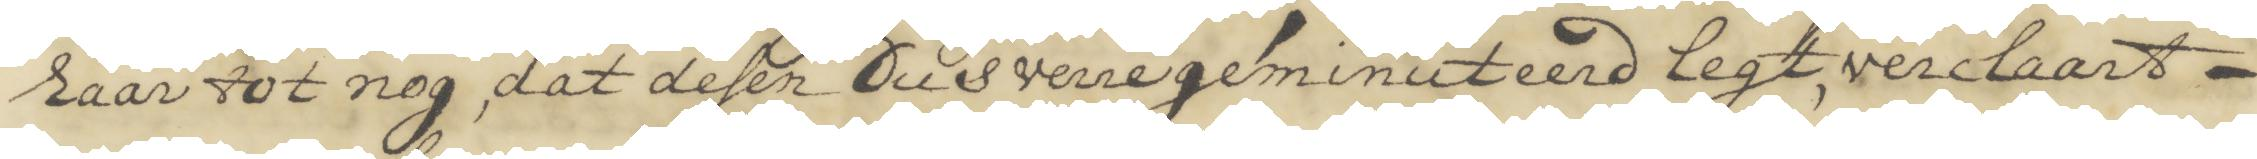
haar tot nog, dat desen dus verre geminuteerd legt, verclaart —
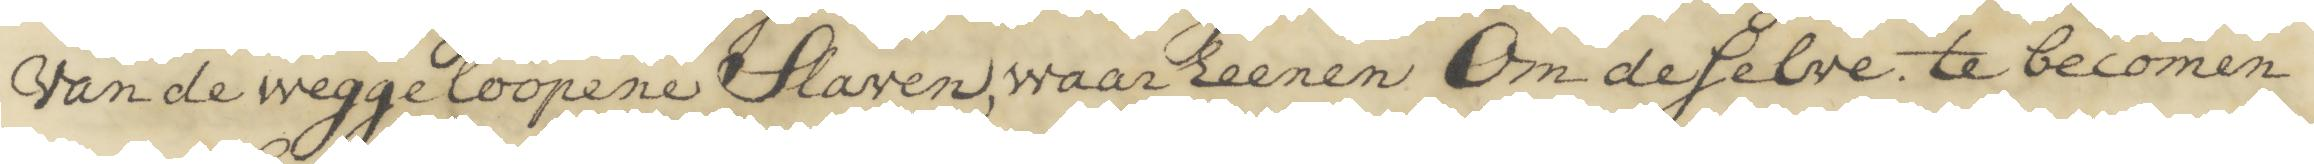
van de weggeloopene slaven, waar heenen Om deselve te becomen
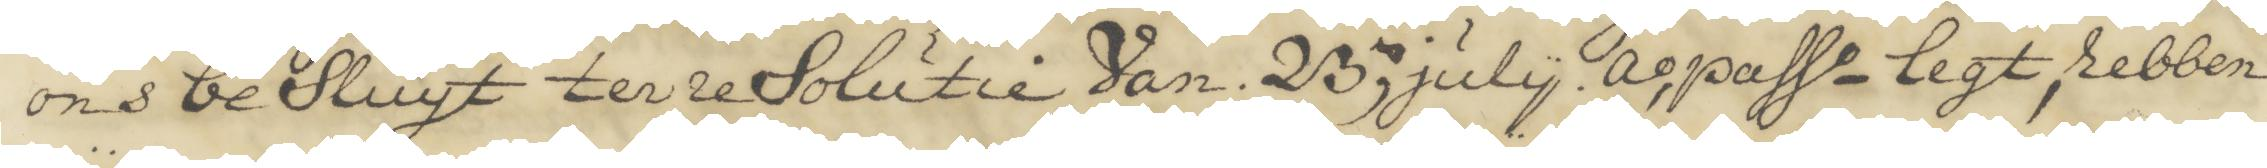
ons besluijt ter resolutie Van. 23,' julij. a,o pass-o legt, hebben
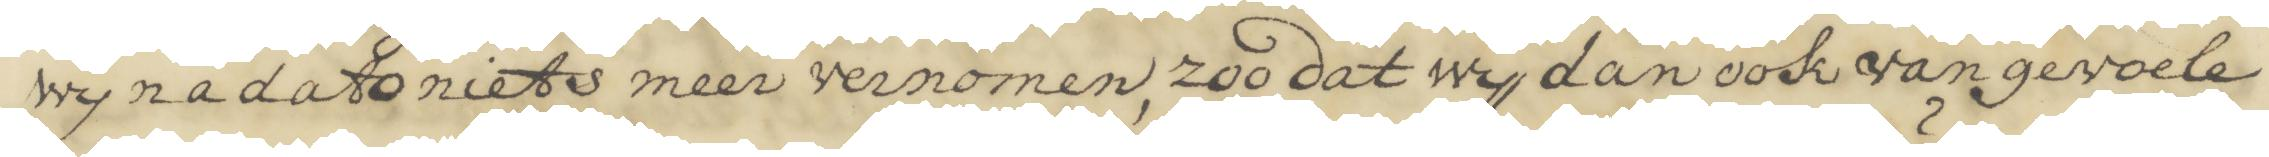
wij na dato niets meer vernomen, zoo dat wij dan ook van gevoele
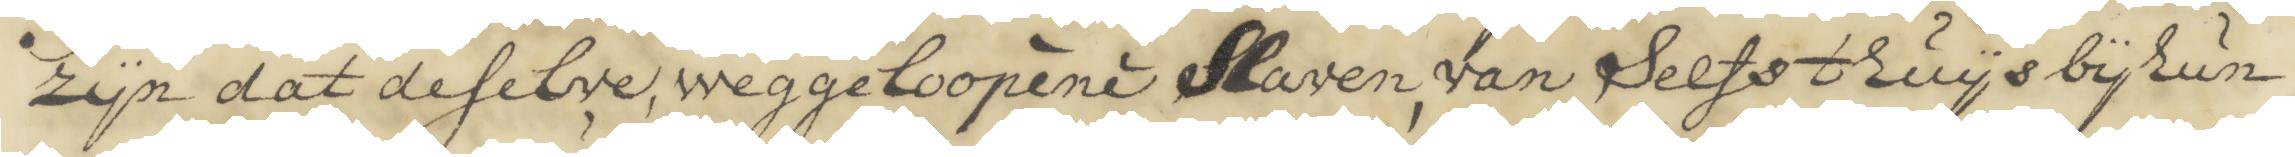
zijn dat deselve, weggeloopene slaven, van selfs t huijs bij hun
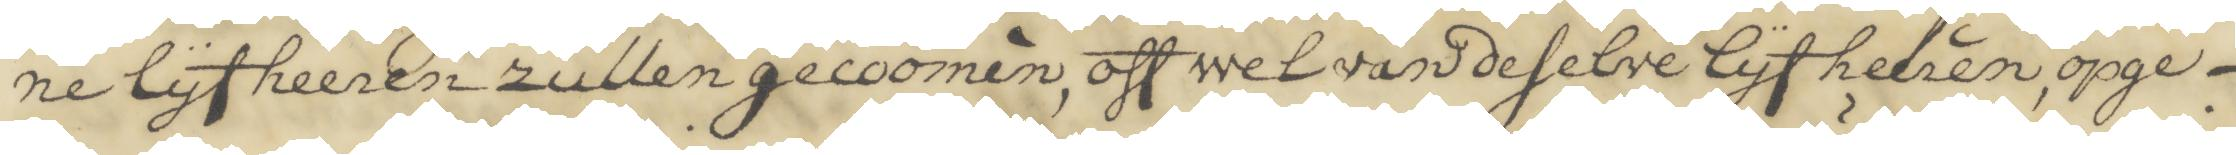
ne lijfheeren zullen gecoomen, off wel van deselve lijfheeren, opge
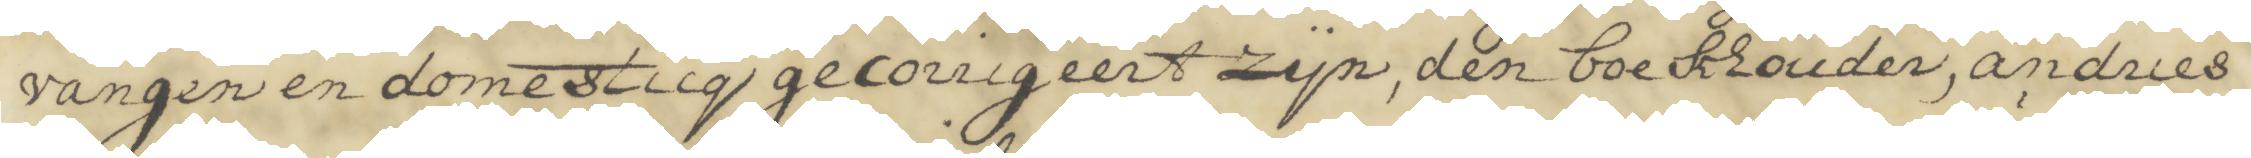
vangen en domesticq gecorrigeert zijn, den boekhouder, andries
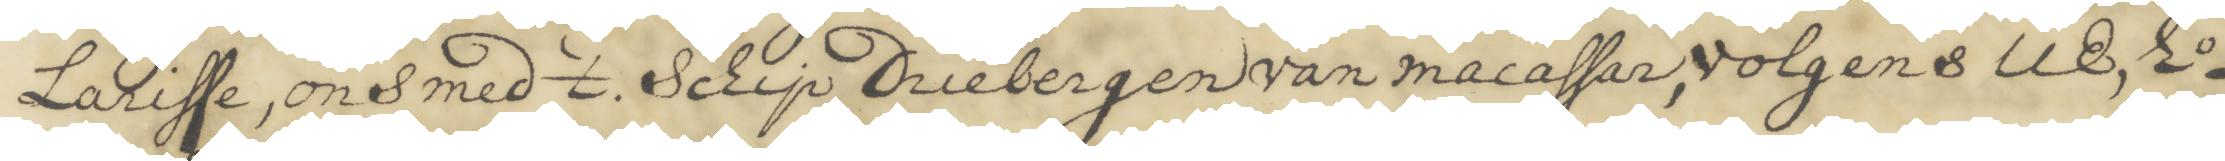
Larisse, ons med't. schip driebergen van macassar, volgens UE, ho
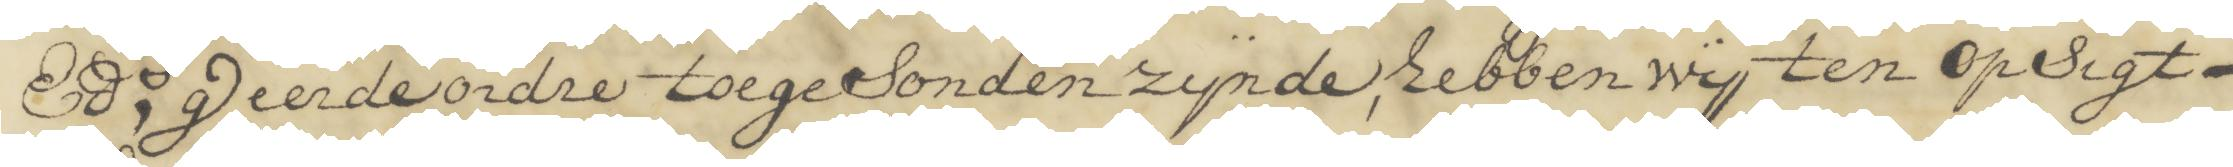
Ed,s g eerde ordre toegesonden zijnde, hebben wij ten opsigt
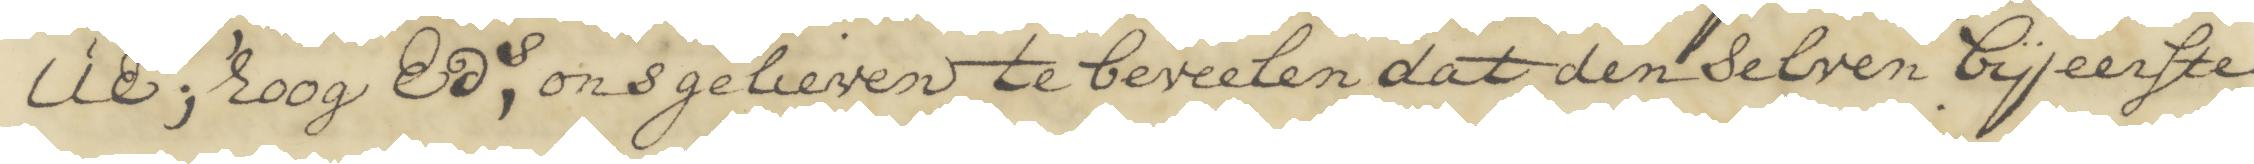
UE; hoog Ed,s ons gelieven te beveelen, dat denselven bij eerste
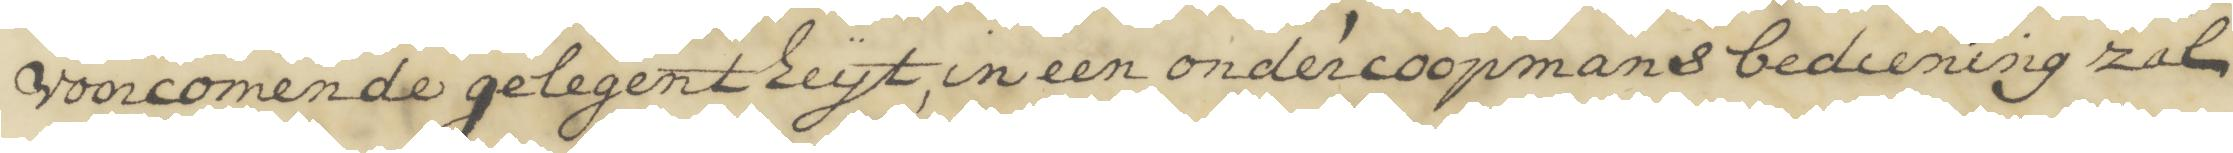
voorcomende gelegentheijt, in een ondercoopmans bediening zal
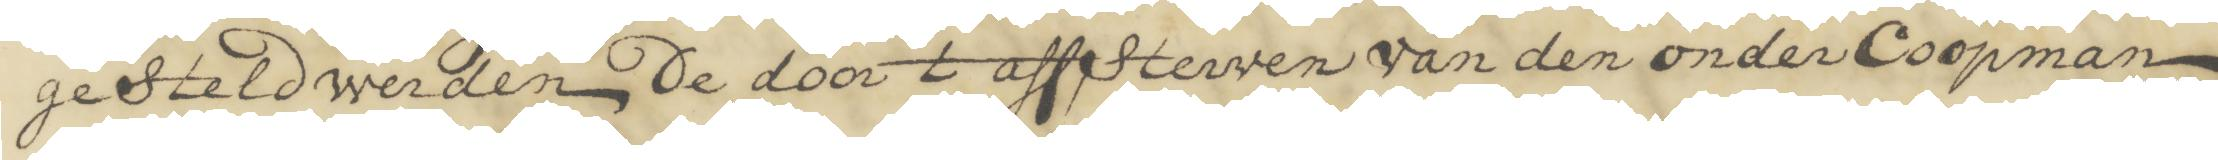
gesteld werden de door ’t affsterven van den onder Coopman
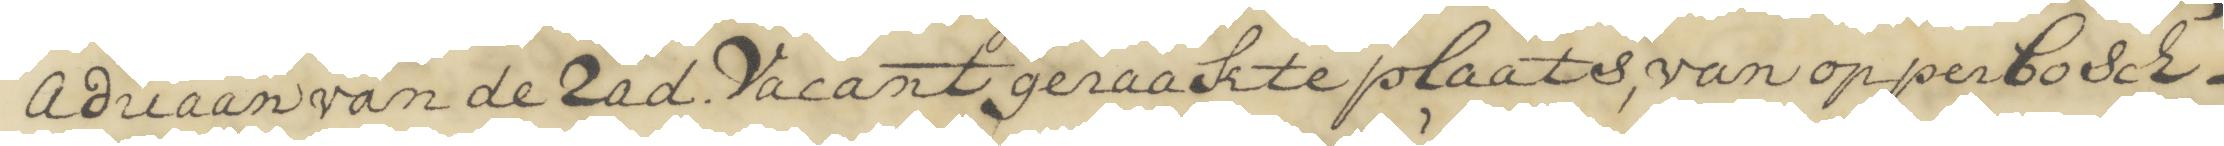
Adriaan van de rad. Vacant geraakte plaats, van opperbosch
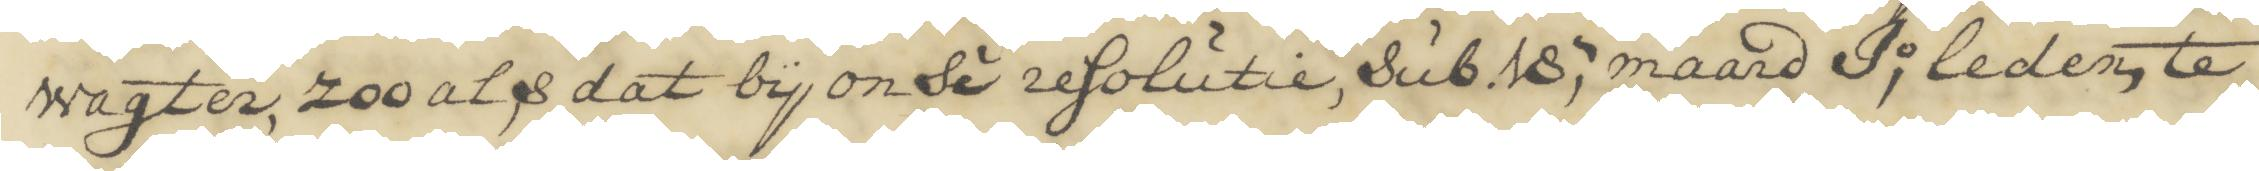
wagter, zoo als dat bij onse resolutie, sub 18,' maard I,o leden te
